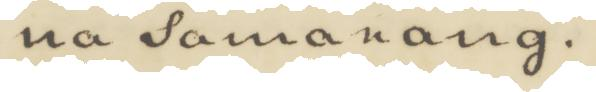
na Samarang.
